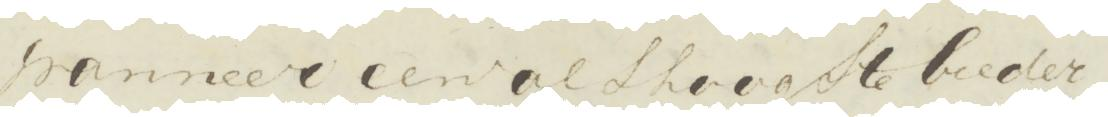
wanneer een als hoogste bieder
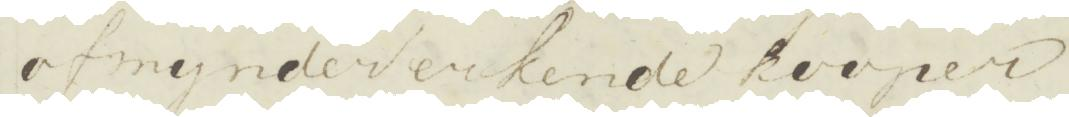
of myn der erkende kooper
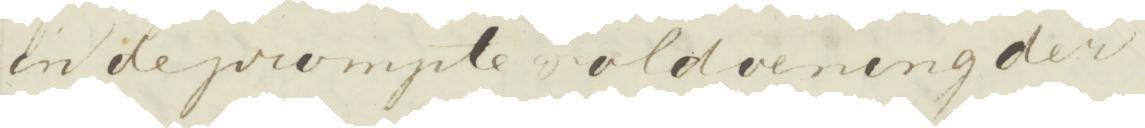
in de prompte voldoening der
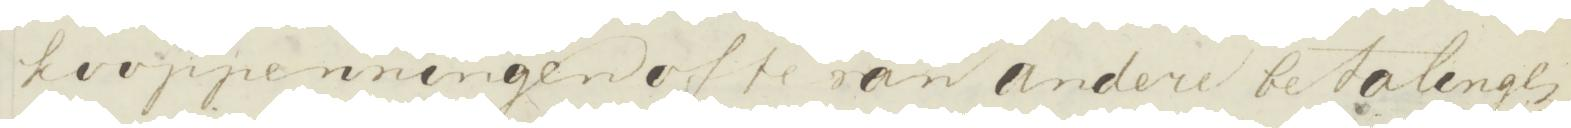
kooppenningen of te van andere betalingen
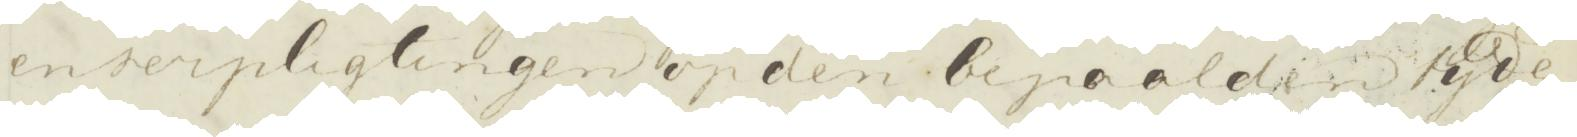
en verpligtingen op den bepaalden tyde
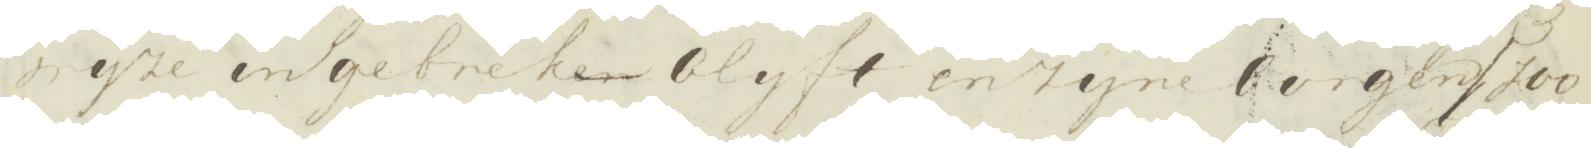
wyze en gebreken blyft en zyne borgen / zoo
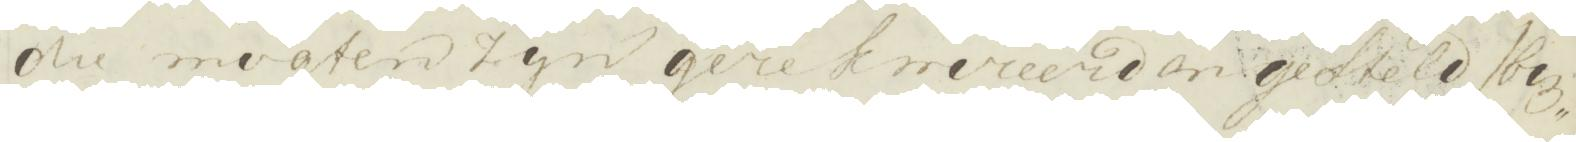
die mogten zyn gerekwireerd en gesteld / bin„
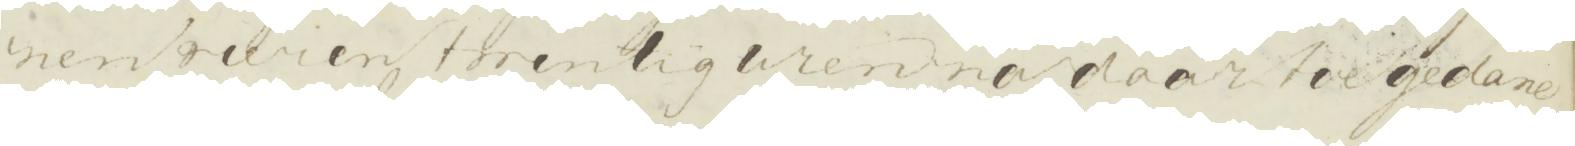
nen vier en twintig uren na daar toe gedane
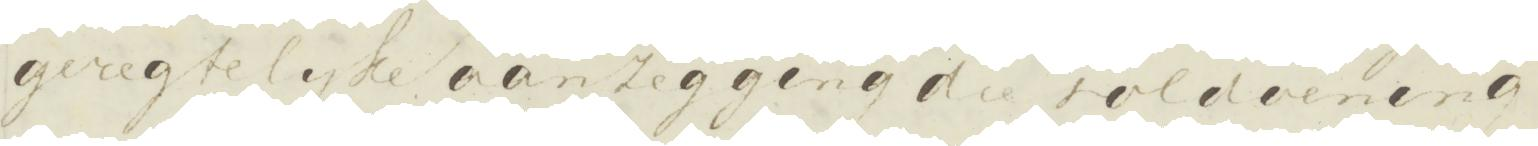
geregtelyke aanzegging die voldoening
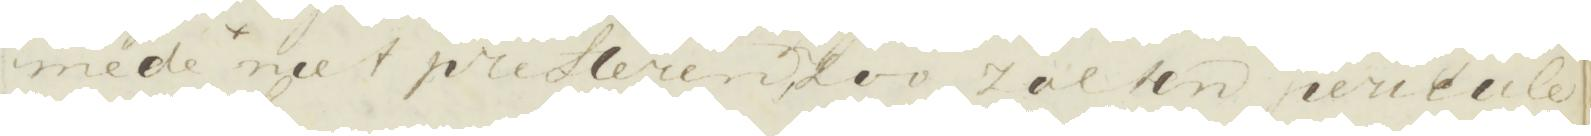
mede niet presteren, zoo zal ten pericule
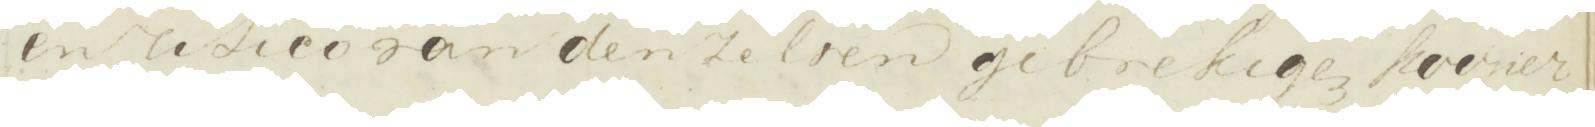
en risico van denzelven gebrekigen kooper
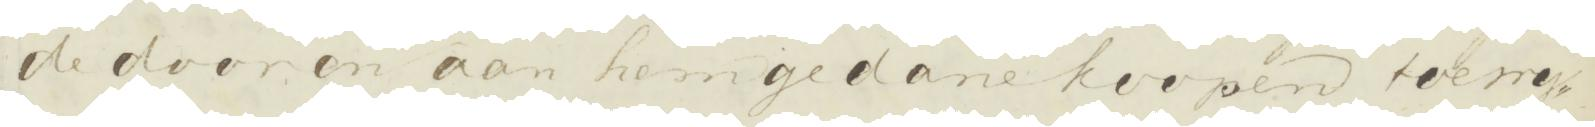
de door en aan hem gedane koopen toewy„
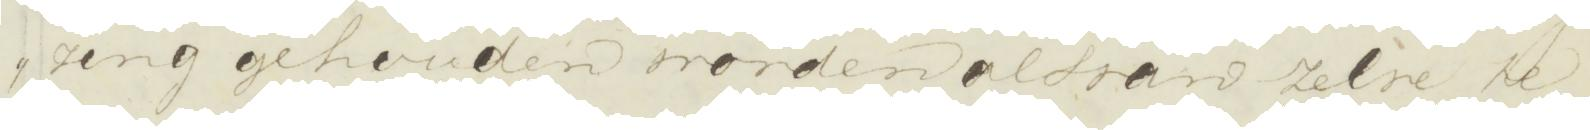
„zing gehouden worden als van zelve te
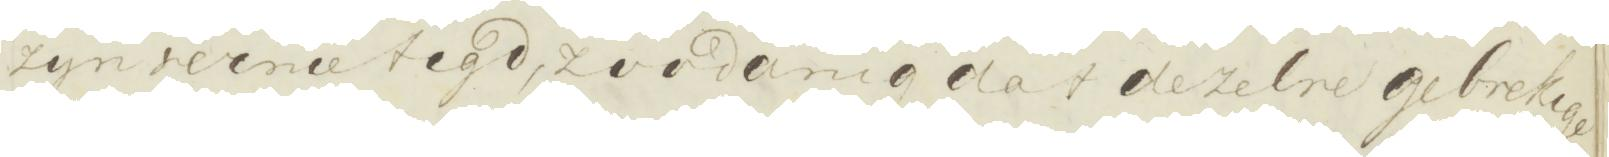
zyn vernietigd, zoodanig dat dezelve gebrekige
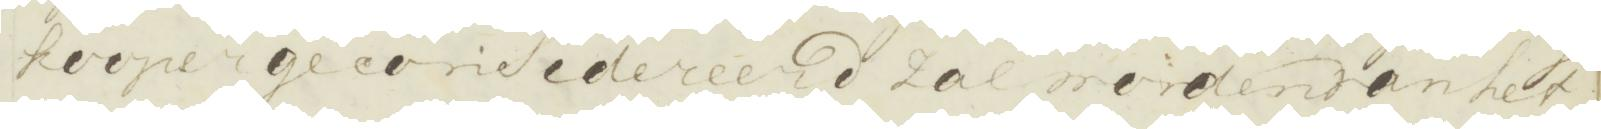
kooper geconsidereerd zal worden van het
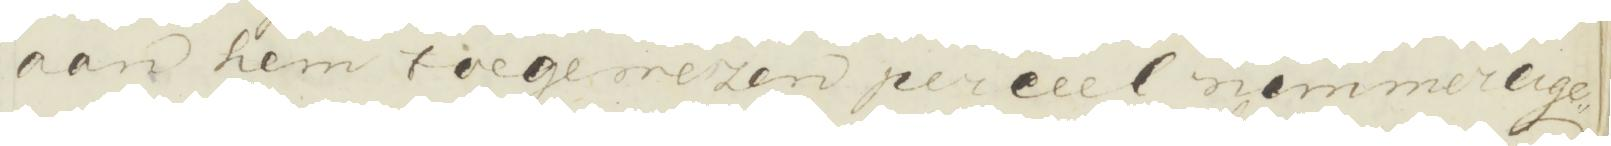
aan hem toegewezen perceel nimmer eige„
